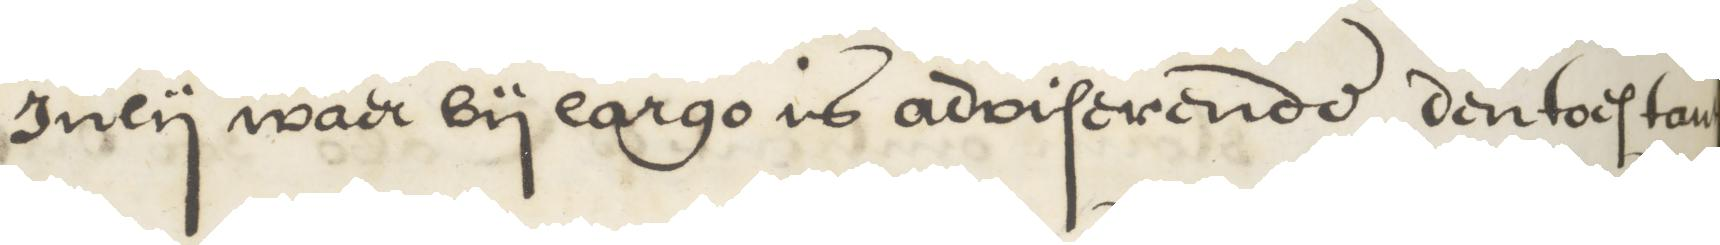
Iulij waer bij largo is adviserende den toestan
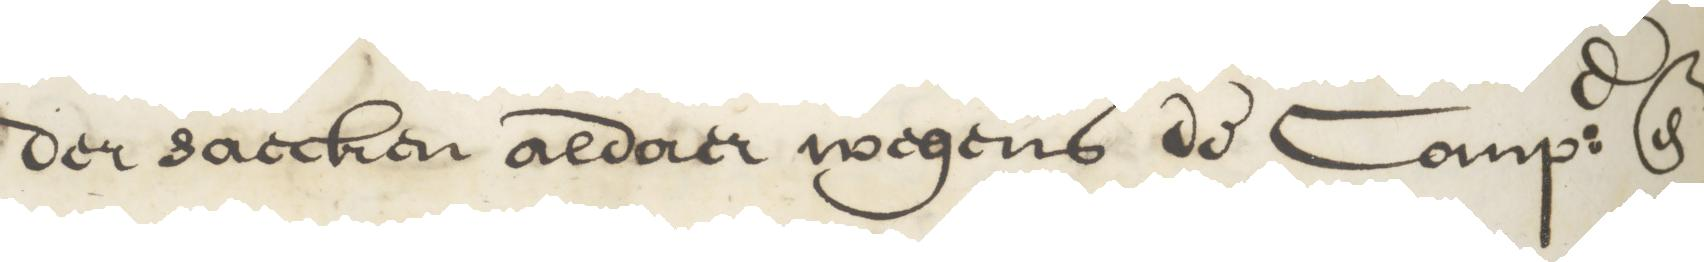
der saecken aldaer wegens de Comp:e ende
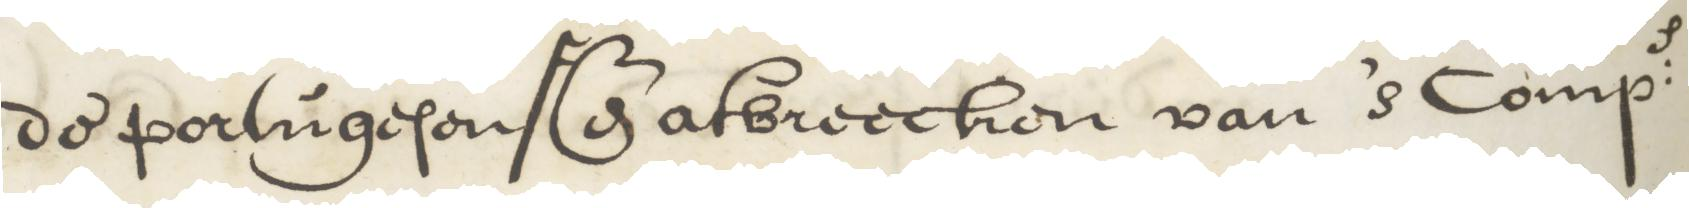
de portugesen / ende afbreecken van ’s Comp:s
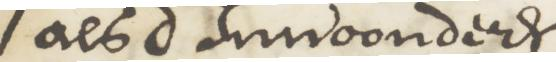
/ als d' Inwoonderen
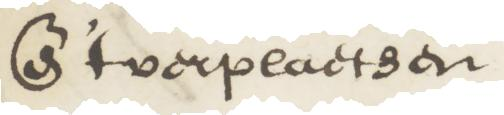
ende 't verplaetsen
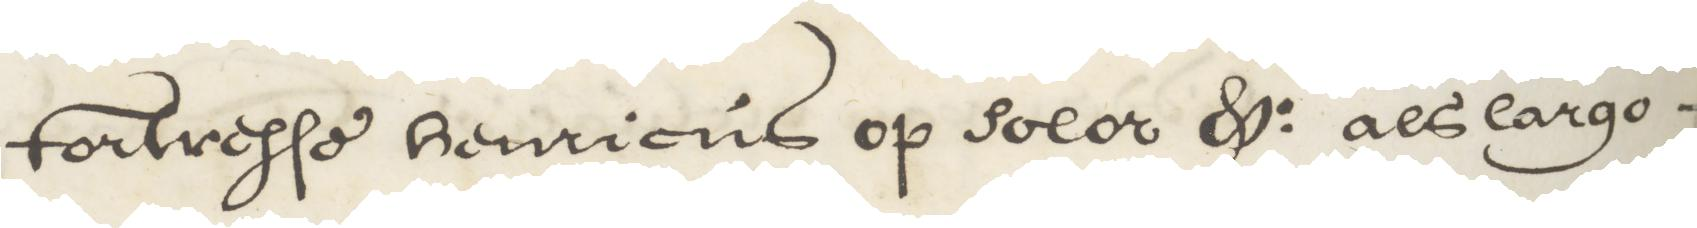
fortresse henricus op solor &c:a als largo
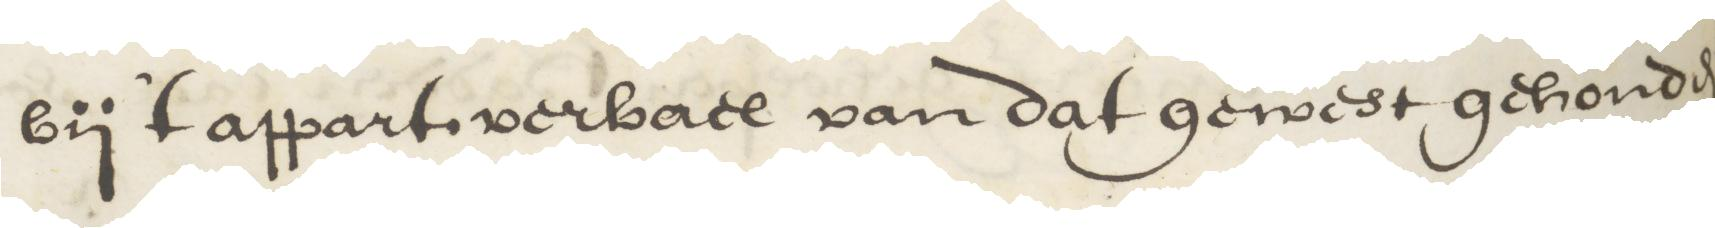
bij ’t appart verbael van dat gewest gehouden
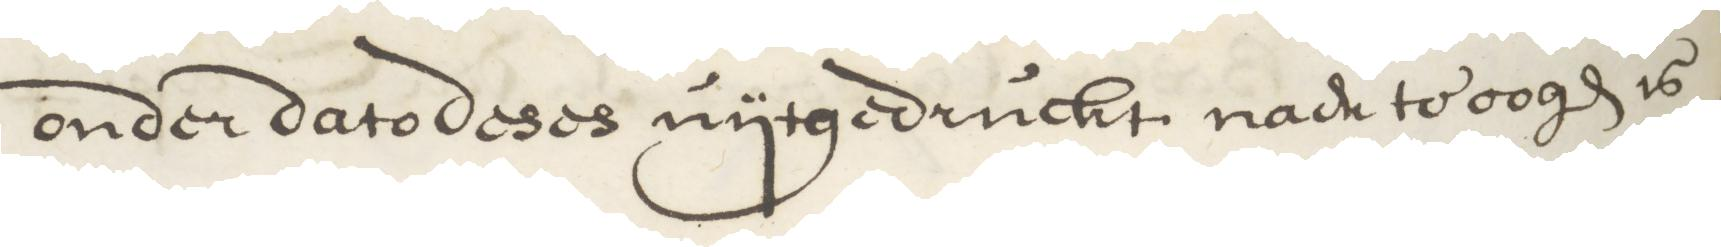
onder dato deses uijtgedruckt naer te oogen is
